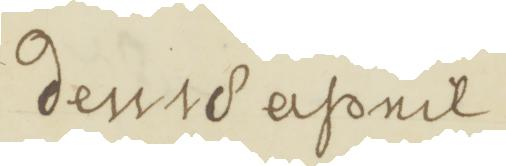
den 18 april
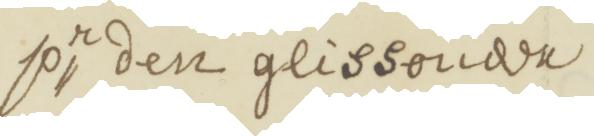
p„r den glissonder
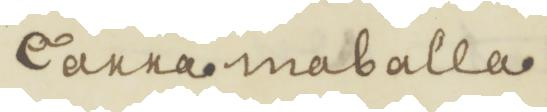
Carra maballa
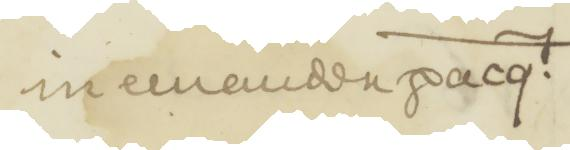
in een ander pacq:t
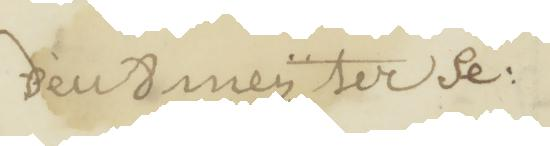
den 8 meij ter se:
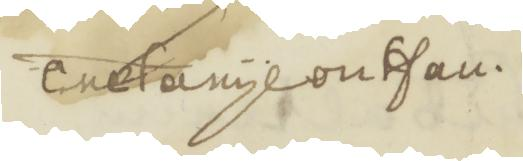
cretarije ontfan„
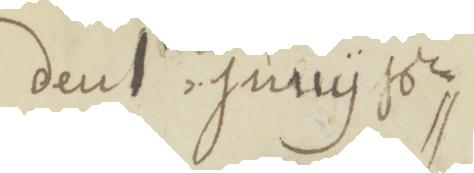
den 1,e Junij p„r
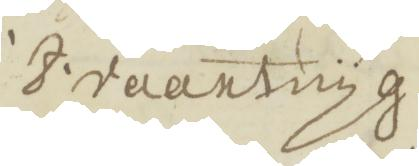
't vaartuijg
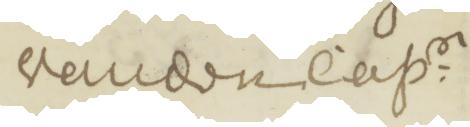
van den Cap:n
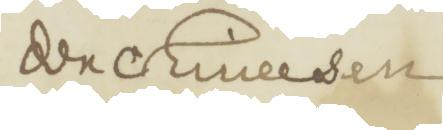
der chineesen
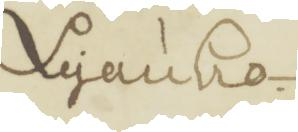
Lijauko.
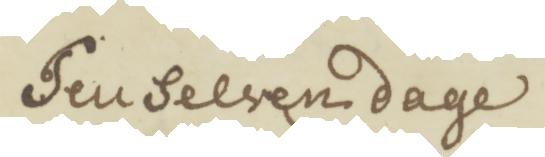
Ten selven dage
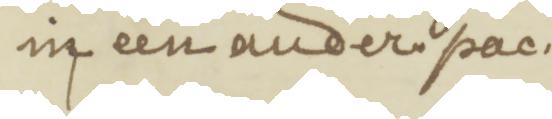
in een ander pac.
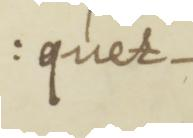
:quet
